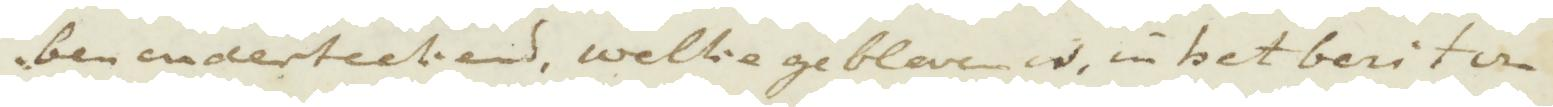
„ben onderteekend, welke gebleve is, in het bezit van
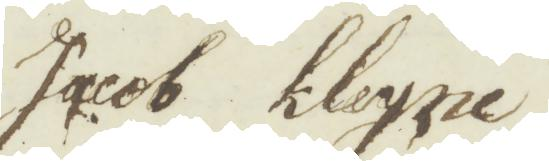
Jacob kleyne
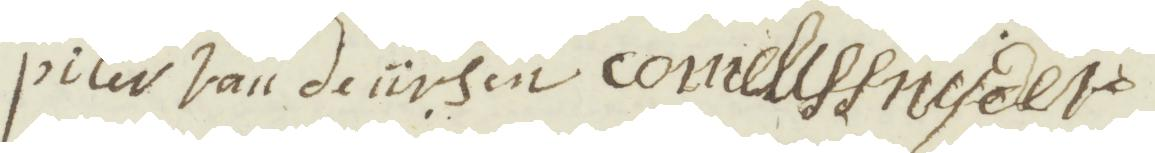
piter van deursen cornelis snyder
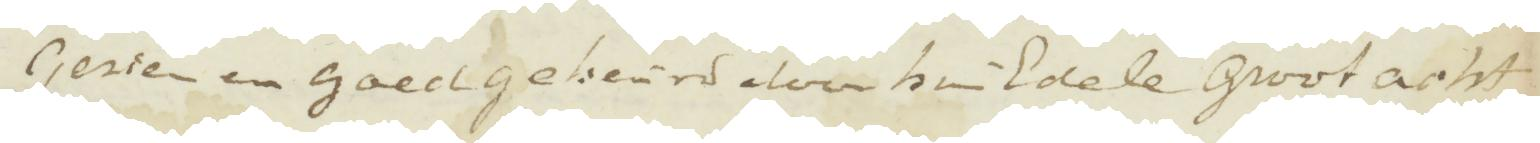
Gezien en goedgekeurd door hun Edele Groot acht
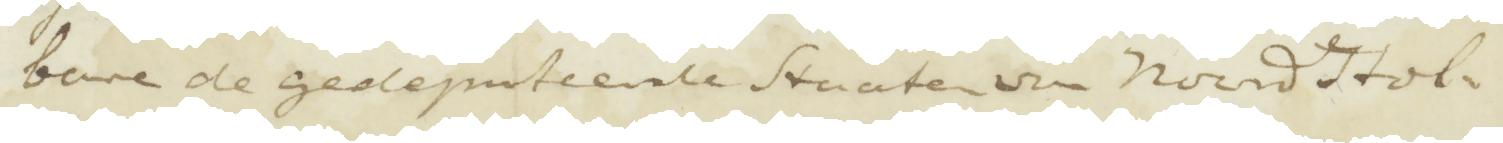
bare de gedeputeerde staaten van noor Hol„
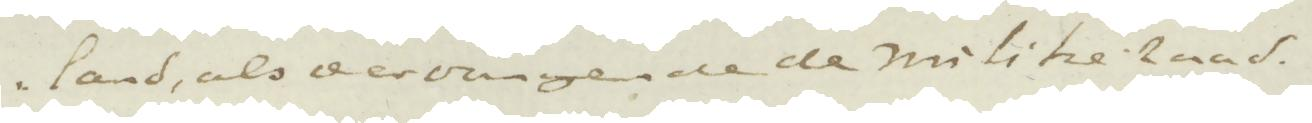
„land, als vervangende de militie raad.
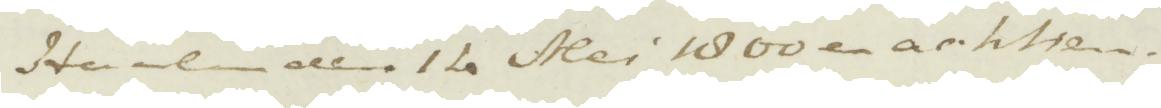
Haarlem den 14 Mei 1800 en achtien
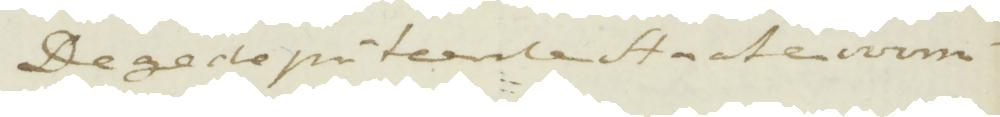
De gedeputeerde staaten voorn
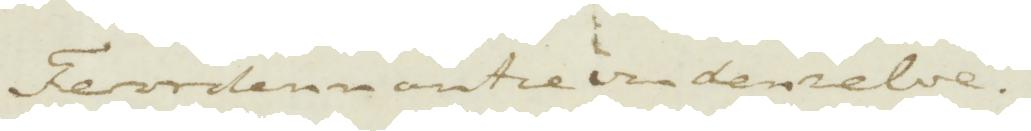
Ter ordennantie van den zelve.
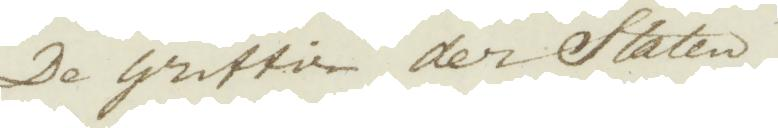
De Griffier der Staten
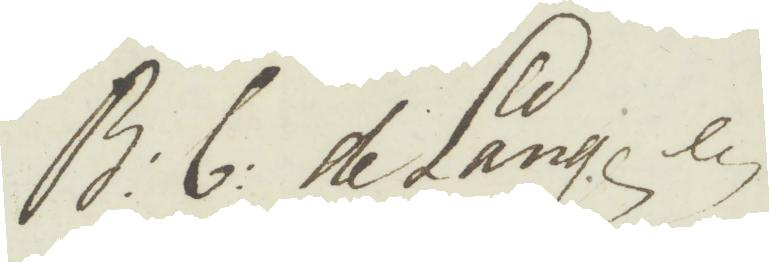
B: C: de Lange en
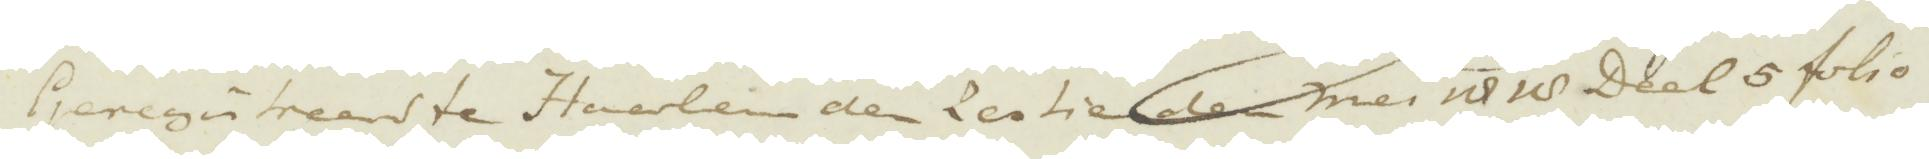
Geregistreerd te Haarlem den zestienden mei 1818 Deel 5 folio
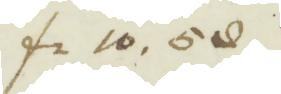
ƒ10. 58
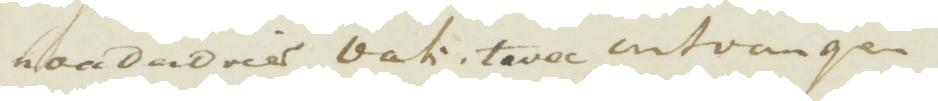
honderdvier vak. twee ontvangen
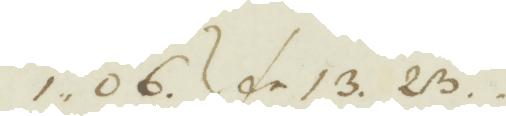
1„ 06. ƒ13. 23.
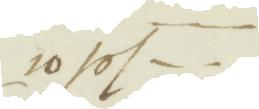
10 pC-
